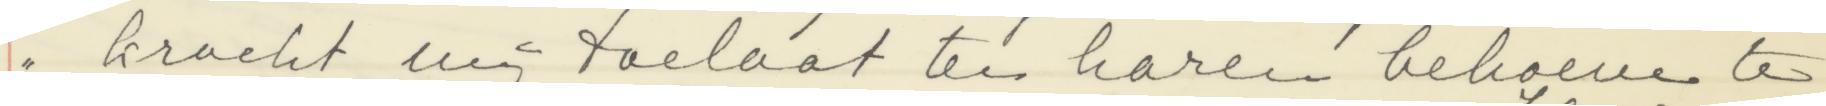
„ kracht mij toelaat te haren behoeve te
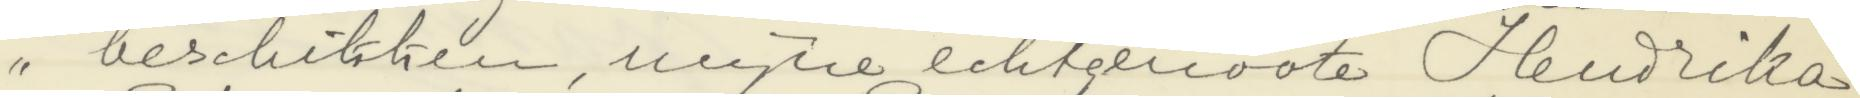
„ beschikken, mijne echtgenoote Hendrika
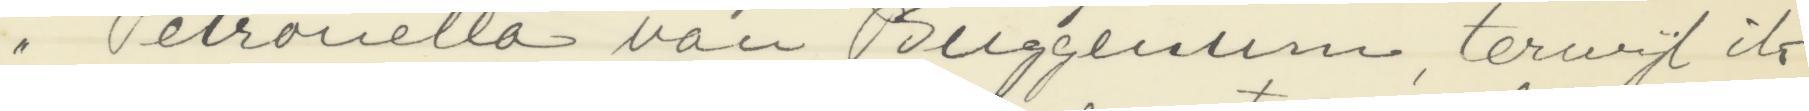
„ Petronella van Buggenum, terwijl ik
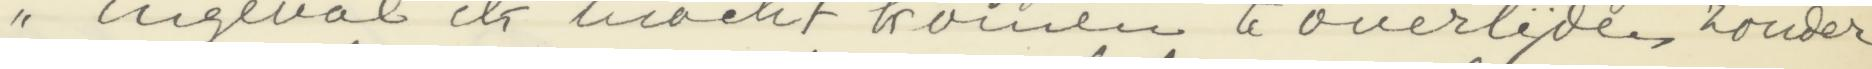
„ ingeval ik mocht komen te overlijden zonder
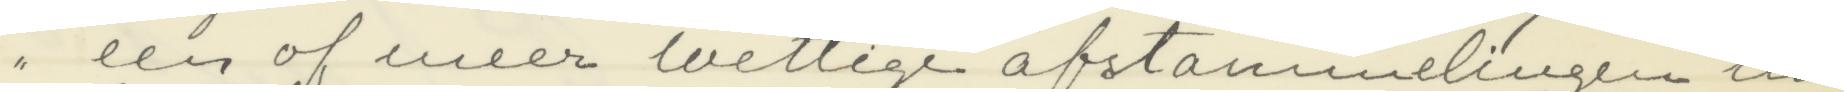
„ een of meer wettige afstammelingen na
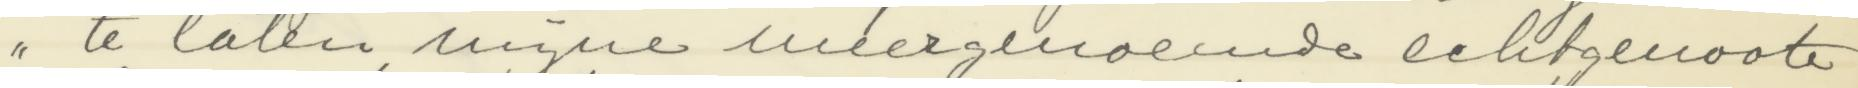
„ te laten, mijne meergenoemde echtgenoote
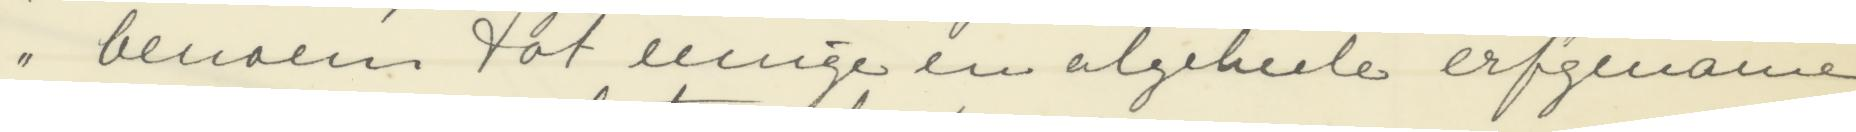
„ benoem tot eenige en algeheele erfgename
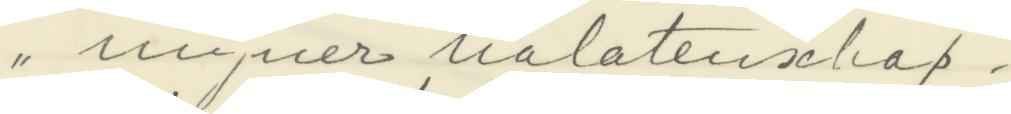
„ mijner nalatenschap.
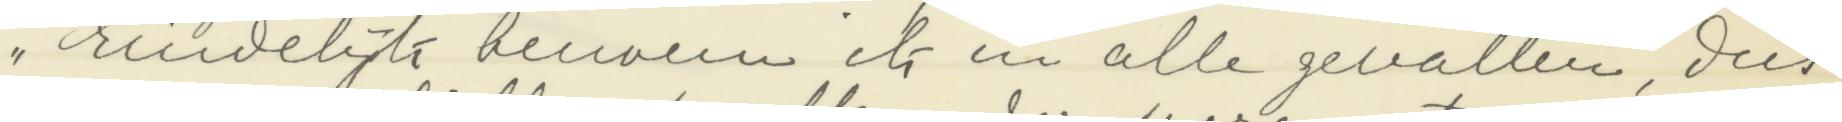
„Eindelijk benoem ik in alle gevallen, dies
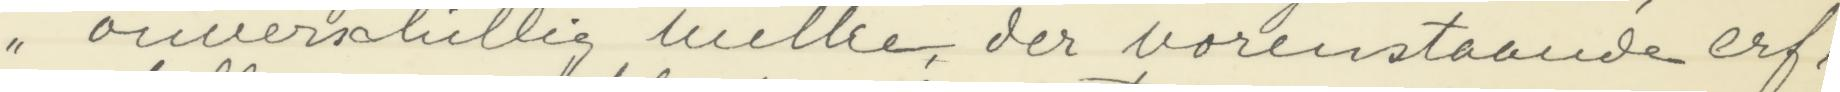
„ onverschillig welke, der vorenstaande Erf,
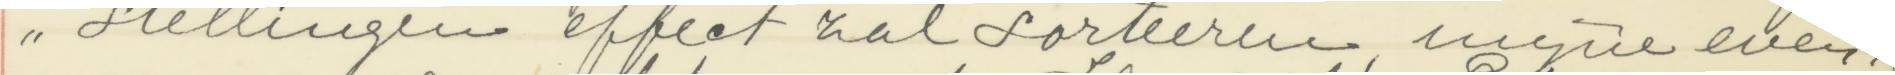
„stellingen effect zal sorteeren, mijne even=
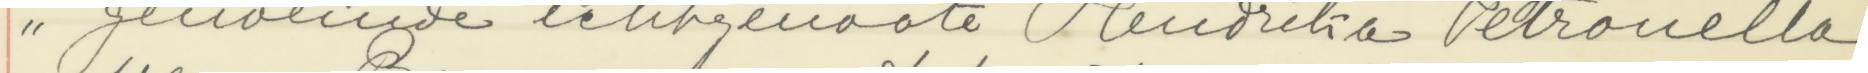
„ genoemde echtgenoote Hendrika Petronella
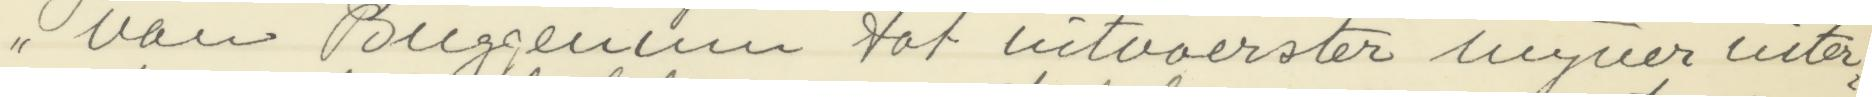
van Buggenum tot uitvoerster mijner uiter=
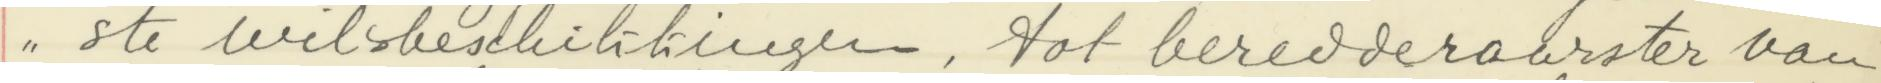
„ste wilsbeschikkingen, tot beredderaarster van
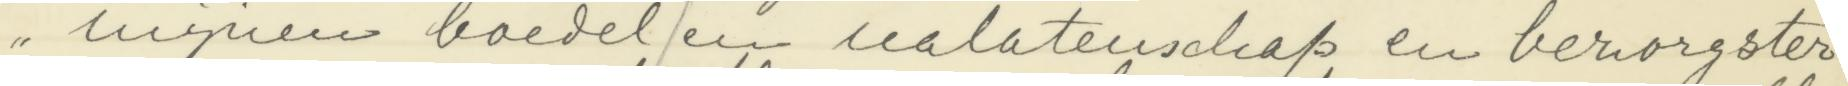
„mijnen boedel en nalatenschap en bezorgster
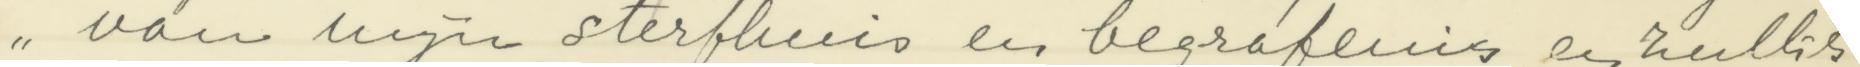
„ van mijn sterfhuis en begrafenis en zulks
